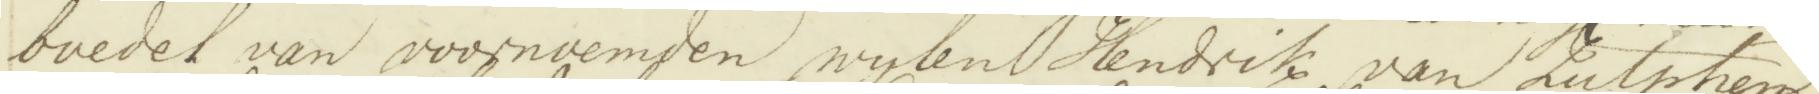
boedel van voornoemden wylen Hendrik van Zutphen
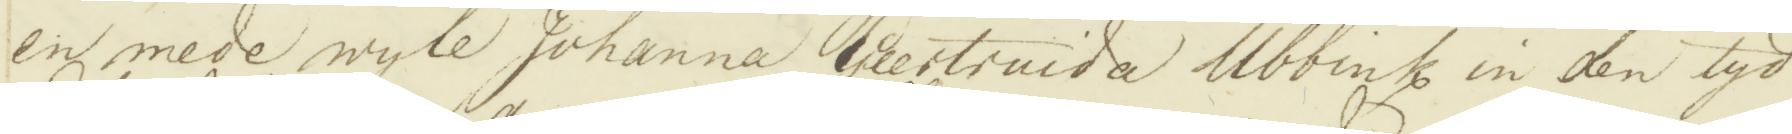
en mede wyle Johanna Geertruida Ubbink in den tyd
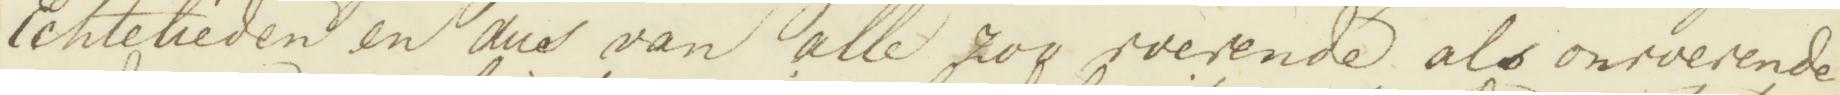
Echtelieden en dus van alle zoo roerende als onroerende
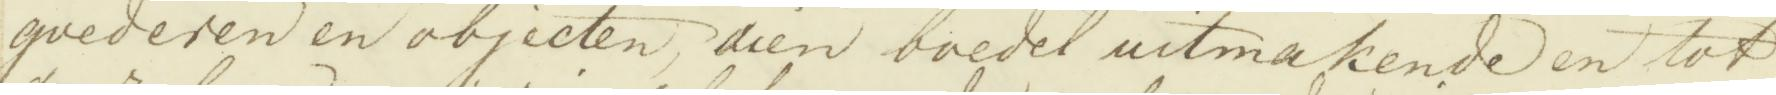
goederen en objecten, dien boedel uitmakende en tot
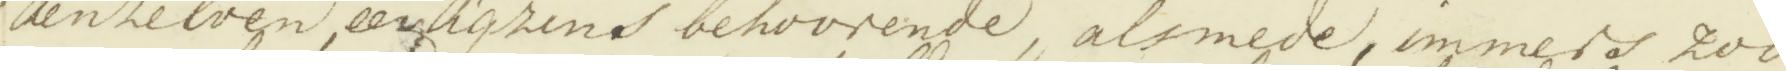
denzelven eenigzins behoorende, als mede, immers zoo
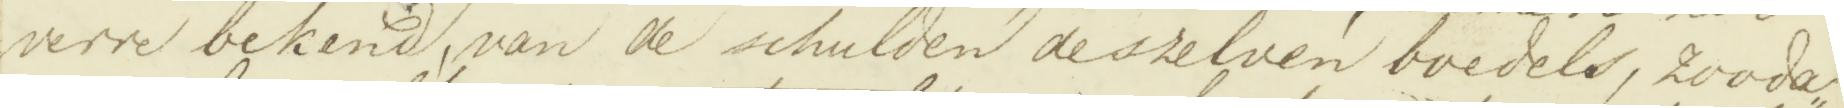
verre bekend, van de schulden deszelven boedels, zooda
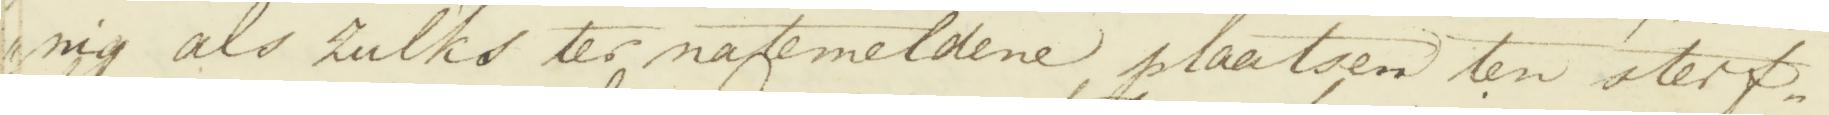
„nig als zulks ter natemeldene plaatsen ten sterf„
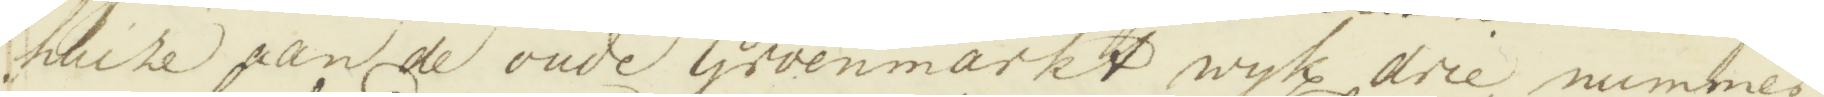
„huise aan de oude Groenmarkt wyk drie nummer
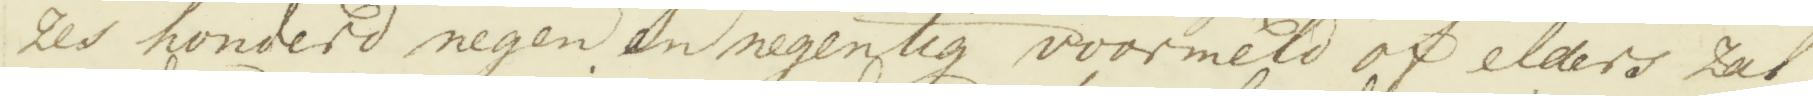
zes honderd negen en negentig voormeld of elders zal
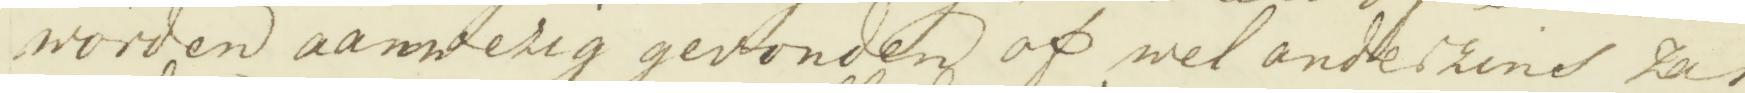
worden aanwezig gevonden of wel anderzins zal
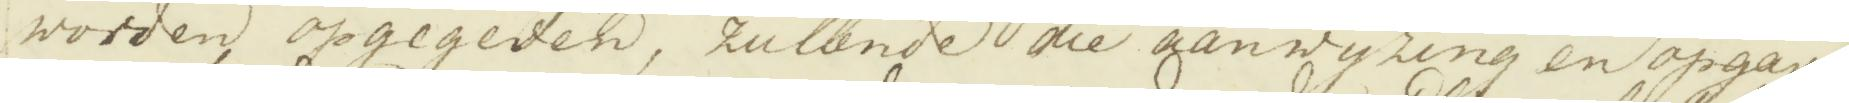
worden opgegeven, zulende die aanwyzing en opgave
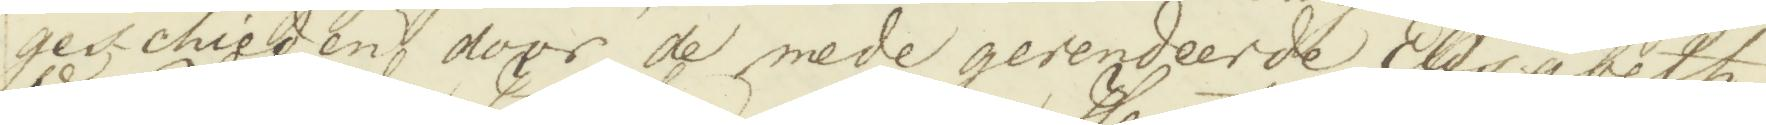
geschieden, door de mede gerendeerde Elisabelh
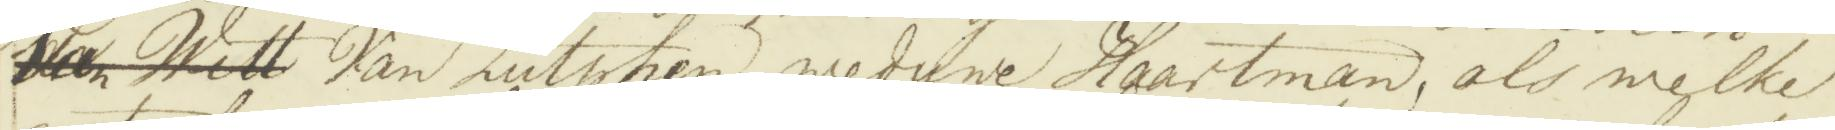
Van Witt Van Zutphen weduwe Haartman, als welke
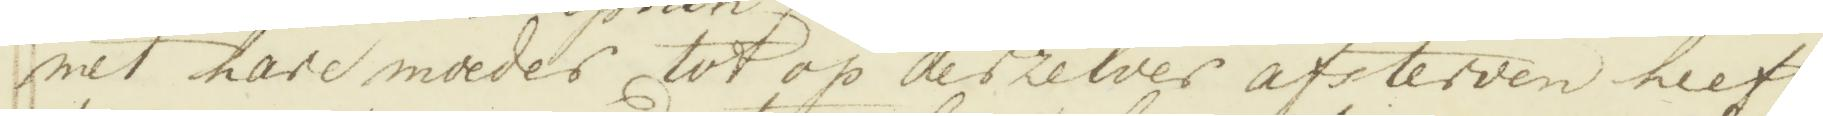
met hare moeder tot op deszelves afsterven heeft
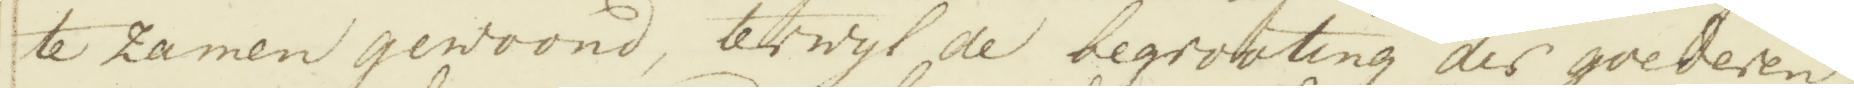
te zamen gewoond, terwijl de begrooting der goederen
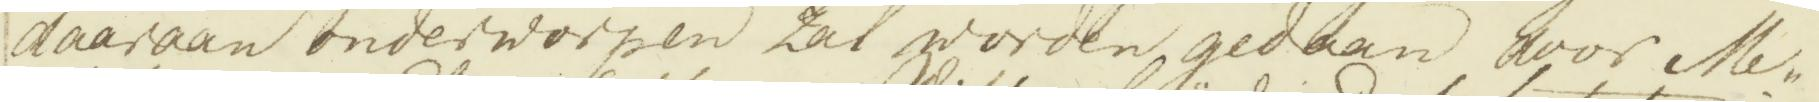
daaraan onderworpen zal worden gedaan door Me„
